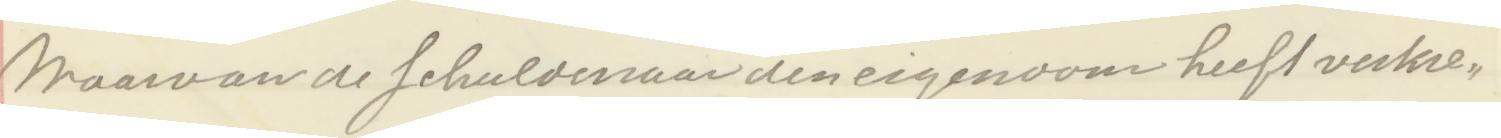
Waarvan de schuldenaar den eigendom heeft verkre„
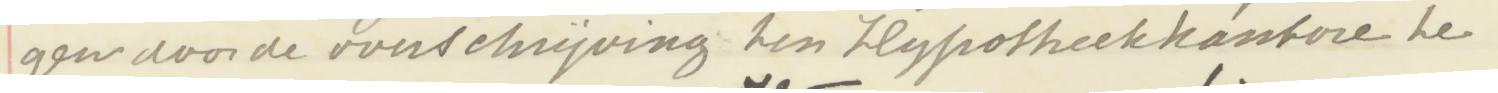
gen door de overschrijving ten Hypotheekkantore te
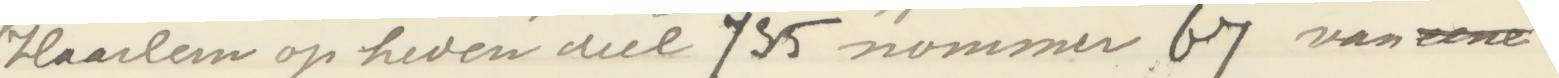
Haarlem op heden deel 735 nummer 67 van eene
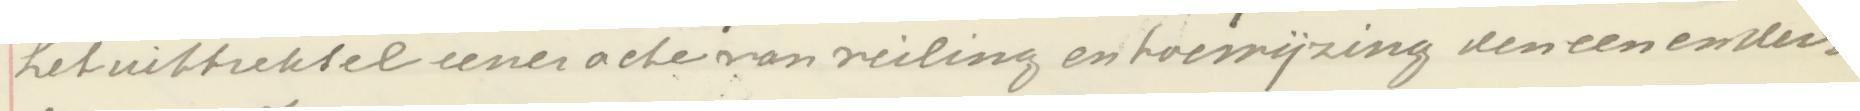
het uittreksel eener acte van veiling en toewijzing den een en der„
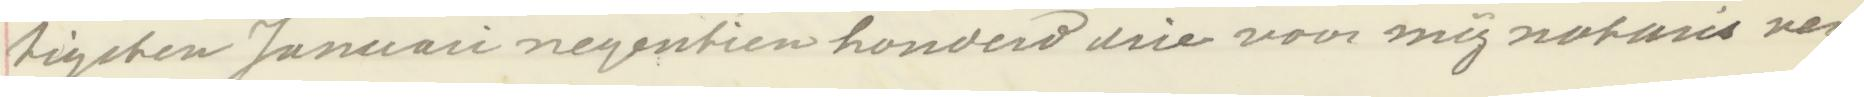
tigsten Januari negentien honderd drie voor mij notaris ver
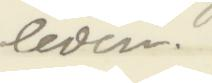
leden.
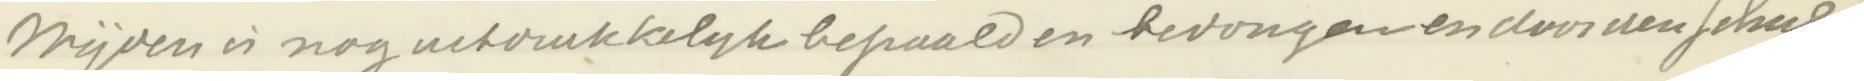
Wijder is nog uitdrukkelyk bepaald en bedongen en door den schul
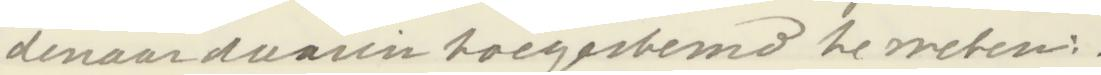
denaar daarin toegestemd te weten:
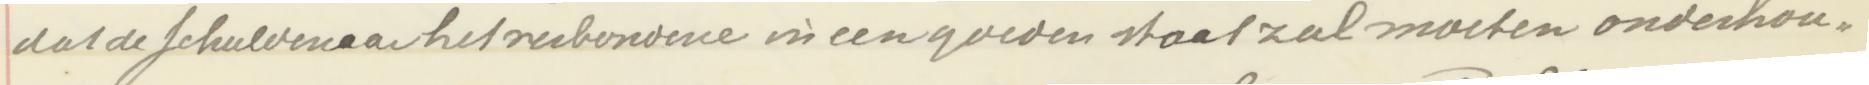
dat de schuldenaar het verbondene in een goeden staat zal moeten onderhou„
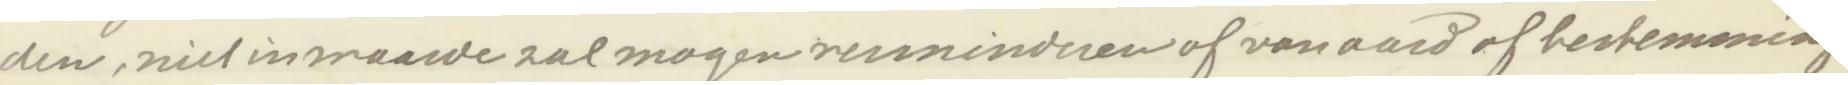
den, niet in waarde zal mogen verminderen of van aard of bestemming
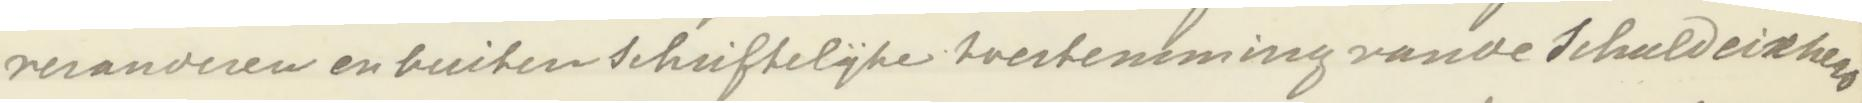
veranderen en buiten schriftelijke toestemming van de schuldeischers
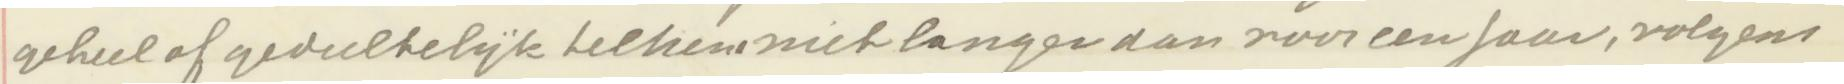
geheel of gedeeltelijk telkens niet langer dan voor een Jaar, volgens
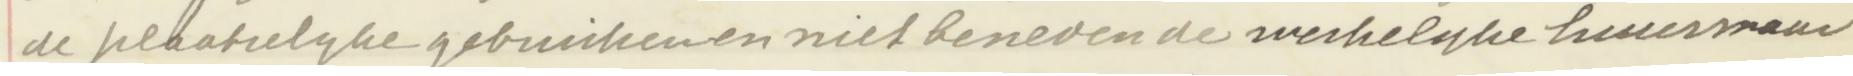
de plaatselyke gebruiken en niet beneven de werkelyke huurwaar
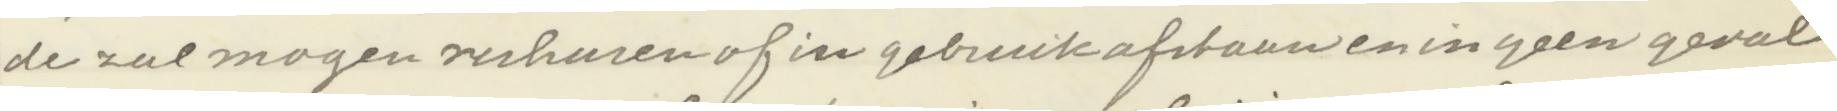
de zal mogen verhuren of in gebruik afstaan en in geen geval
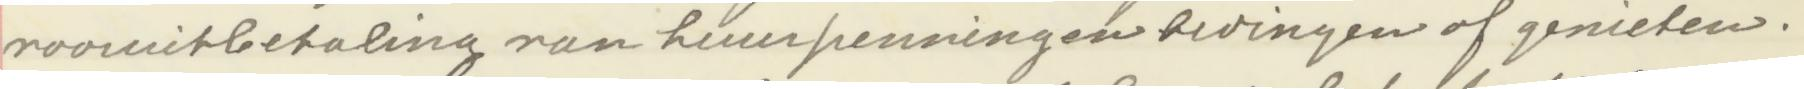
vooruitbetaling van huurpenningen bedingen of genieten.
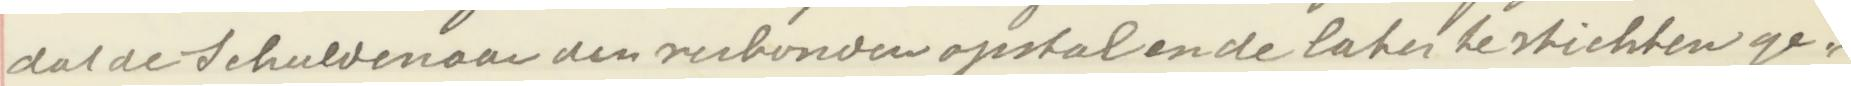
dat de schuldenaar den verbonden opstal en de laten te stichten ge„
